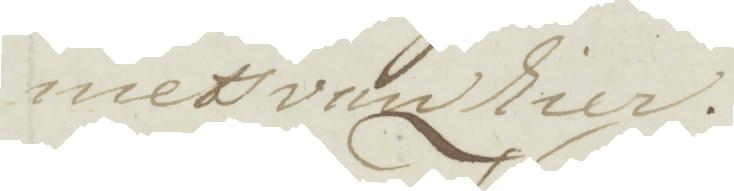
niets van hier.
